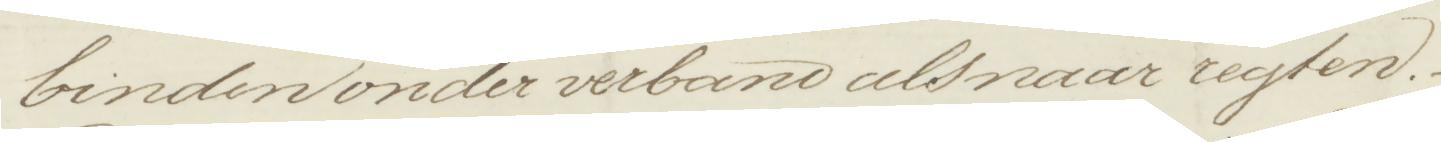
binden onder verband als naar regten.
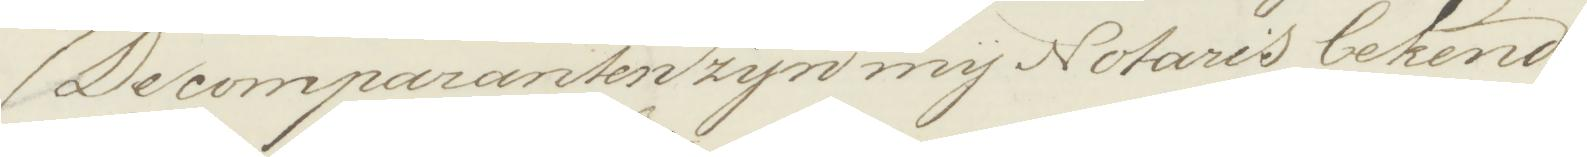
De comparanten zijn mij Notaris bekend
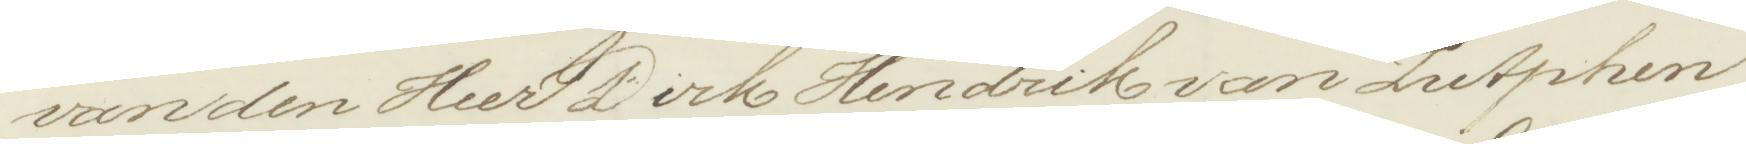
van den Heer Dirk Hendrik van Zutphen
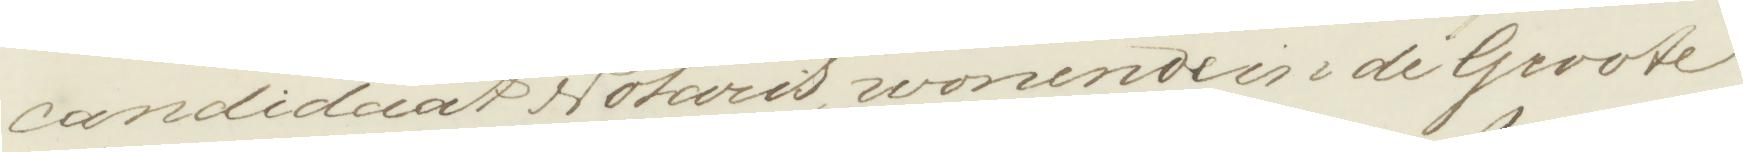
candidaat Notaris, wonende in de Groote
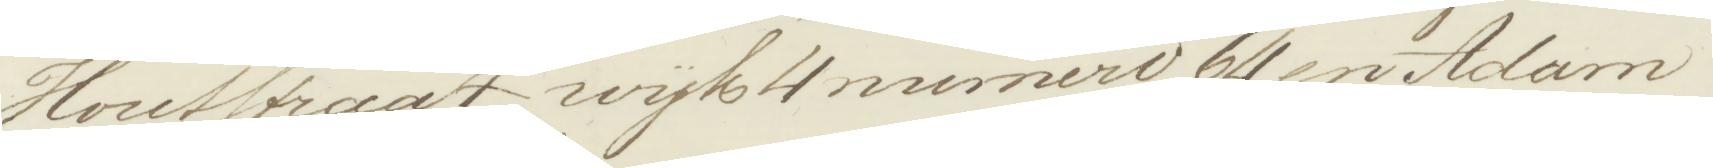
Houtstraat, wijk 4 numero 64 en Adam
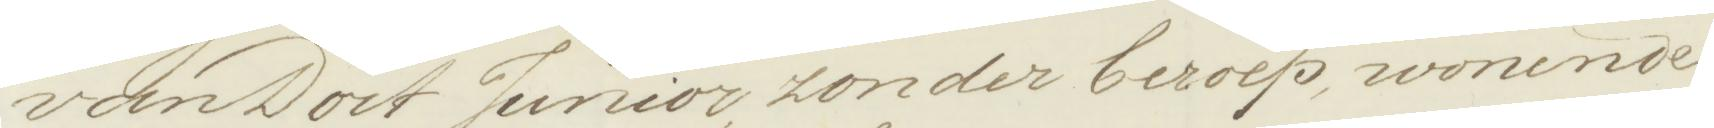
van Dort Junior, zonder beroep, wonende
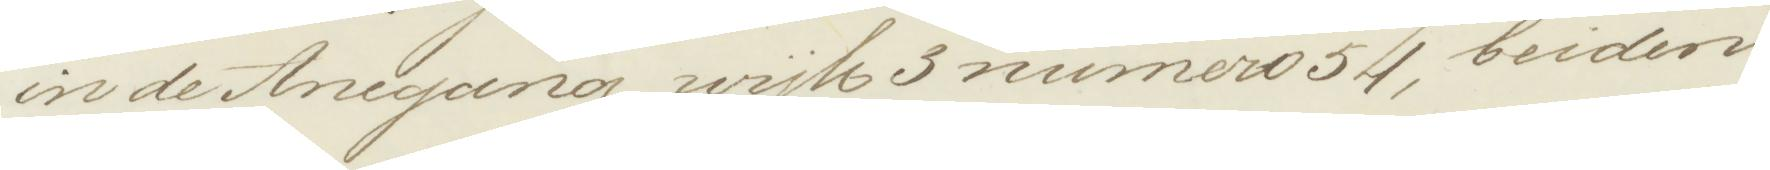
in de Anegang, wijk 3 numero 54, beiden
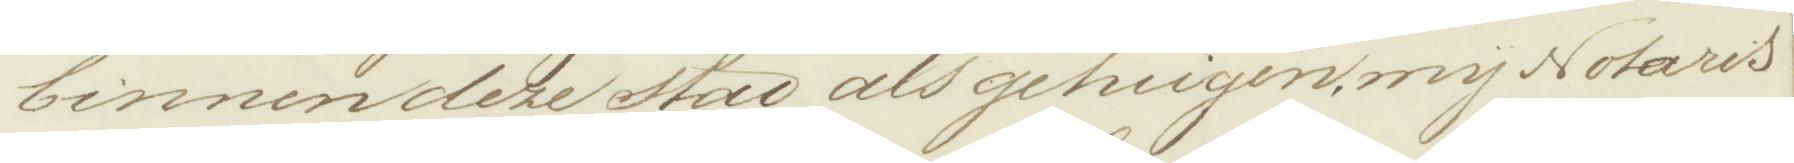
binnen deze stad, als getuigen, mij Notaris
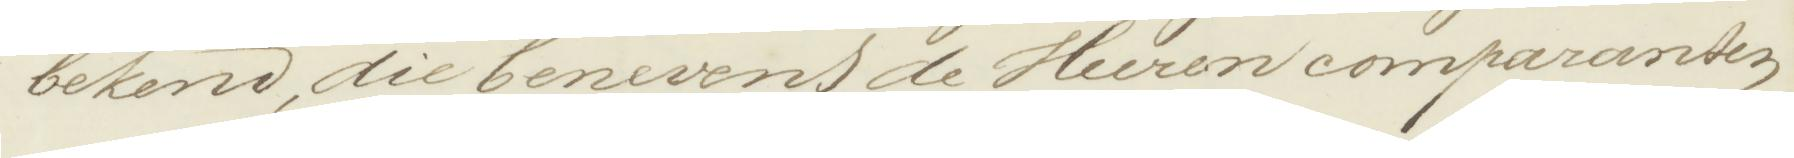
bekend, die benevens de Heeren comparanten
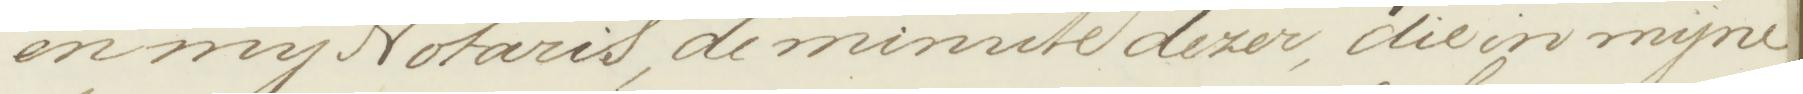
en mij Notaris de minute dezer, die in mijne
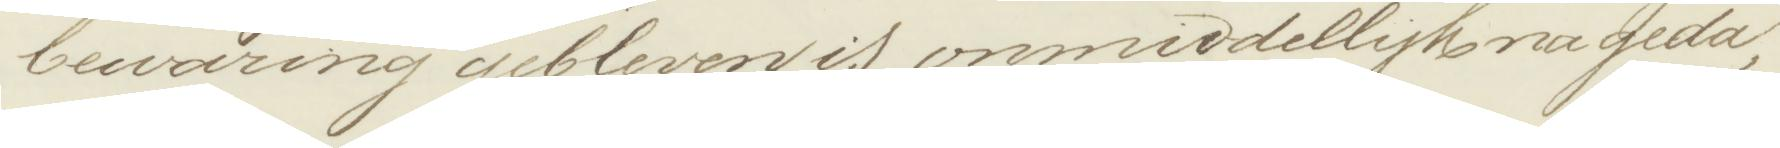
bewaring gebleven is onmiddellijk na geda,
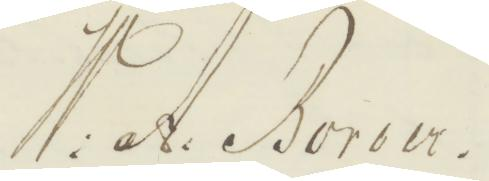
W: A: Borger.
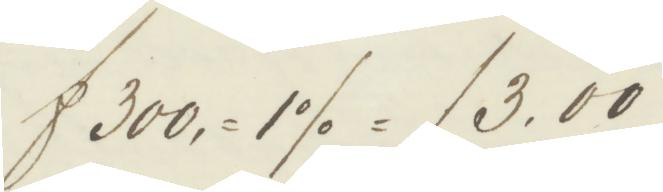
ƒ 300,=1% = ƒ3.00
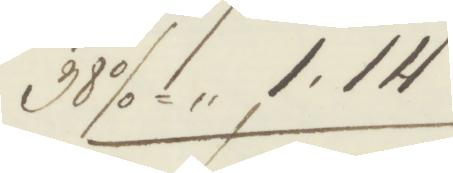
38% = „ 1. 14
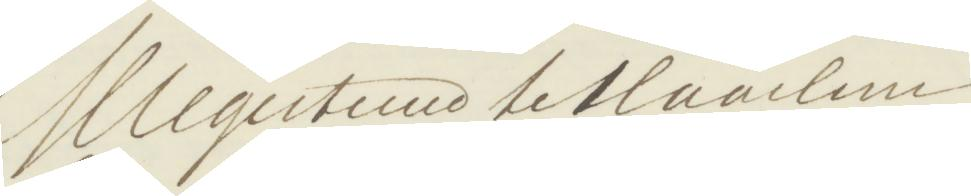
Geregisteerd te Haarlem
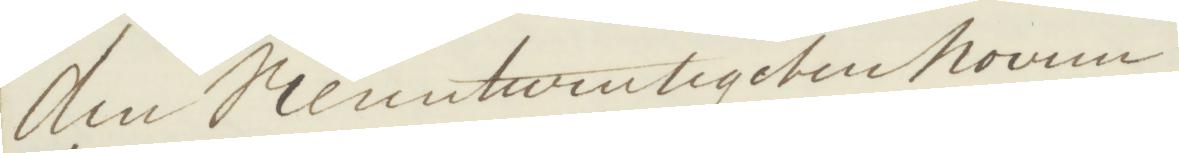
den Vierentwintigsten Novem
